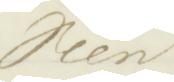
Veen
